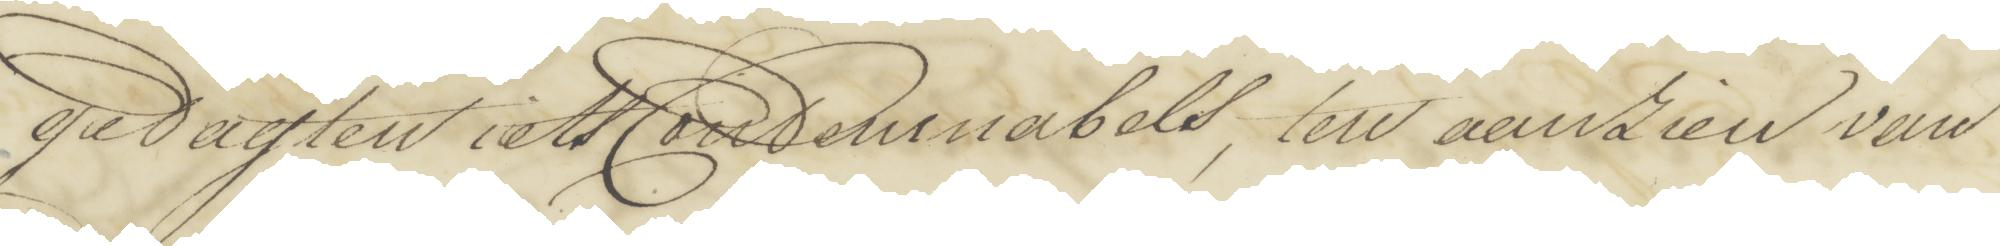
gedagten iets Condemnabels, ten aanzien van
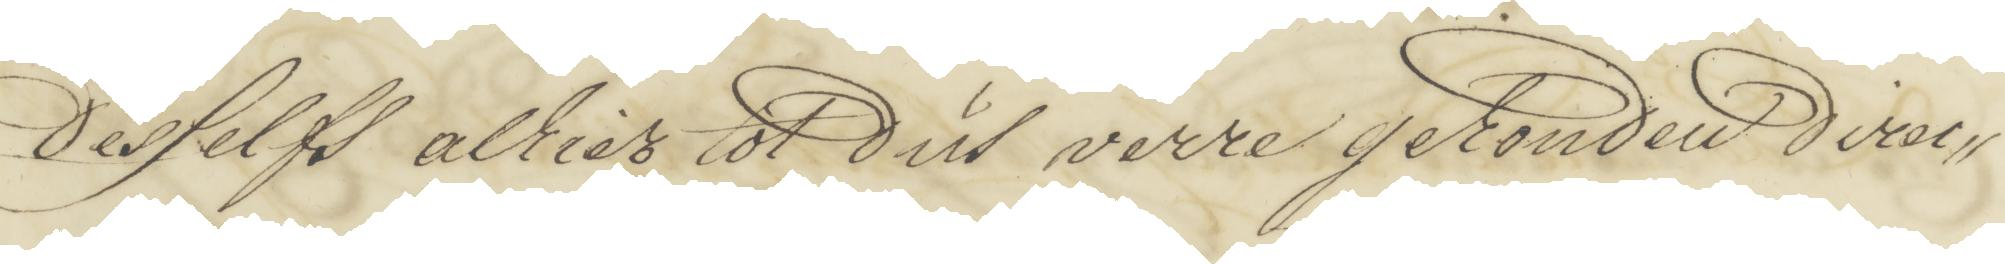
desselfs alhier tot dus verre gehouden direc„
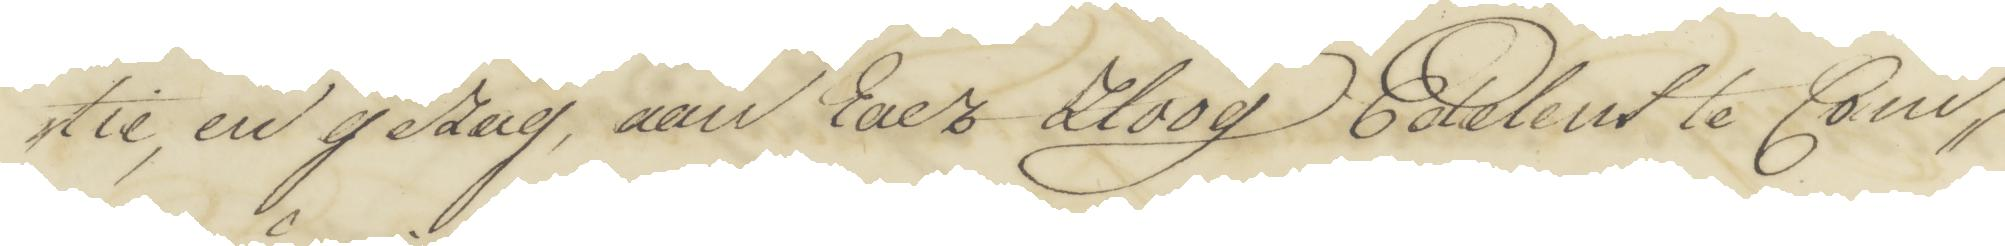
„tie, en gezag, aan haer Hoog Edelens te Com„
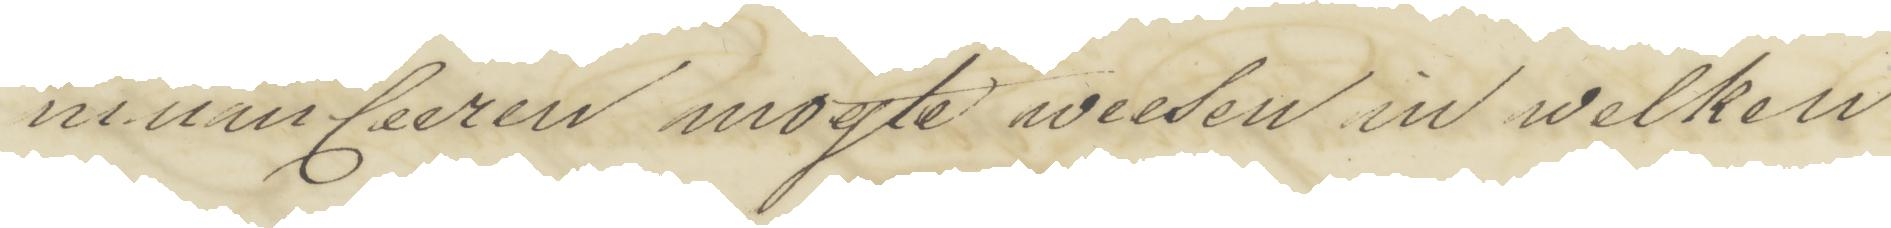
municeeren mogte weesen in welken
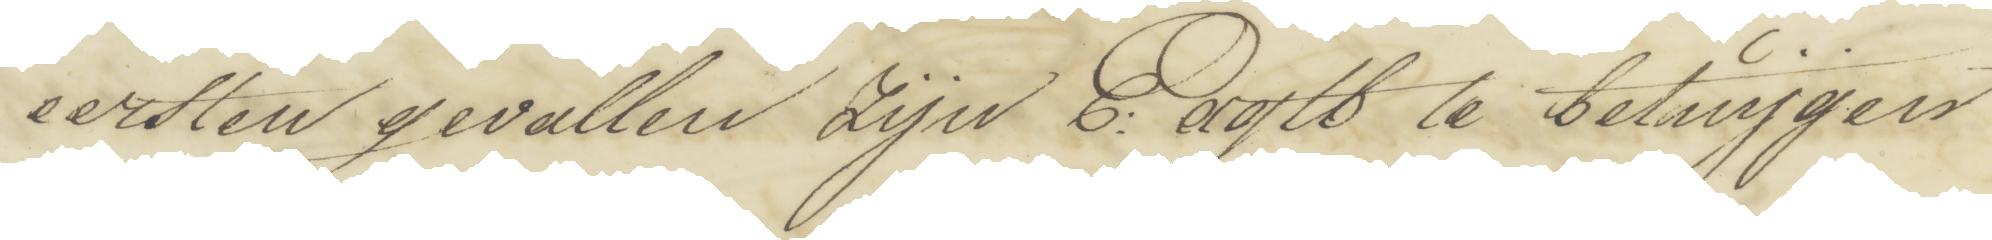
eersten gevallen zijn E. agtb te betuijgen
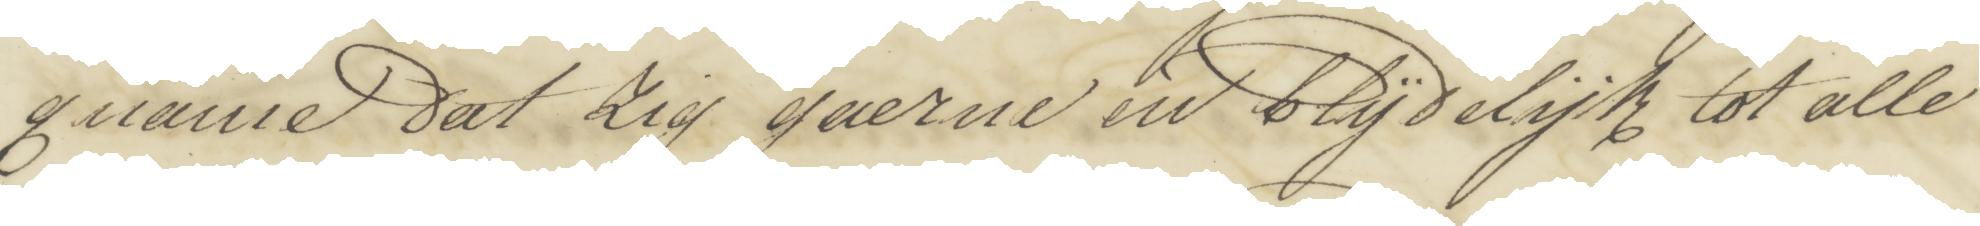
quame dat zig gaerne en blijdelijk tot alle
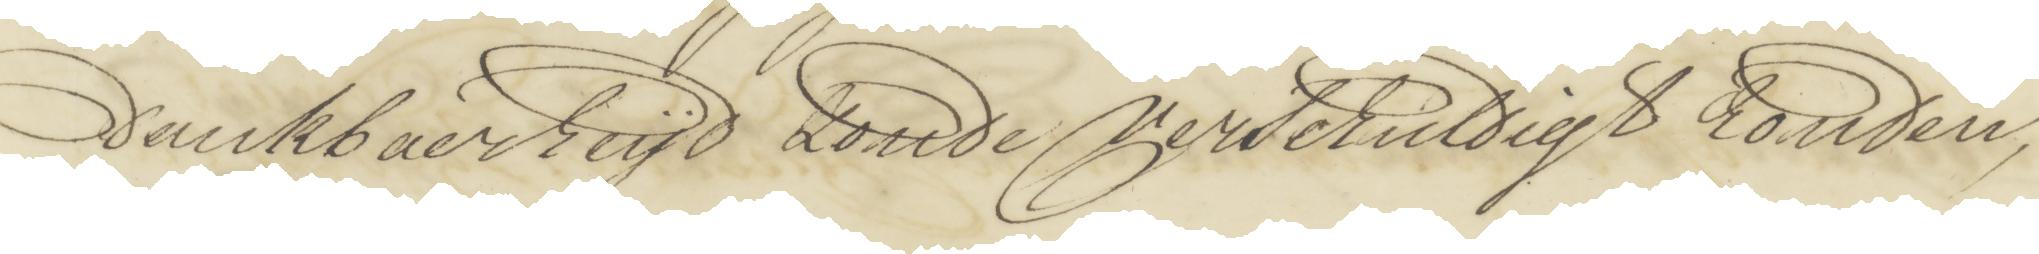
dankbaerheijd zoude verschuldigt houden,
